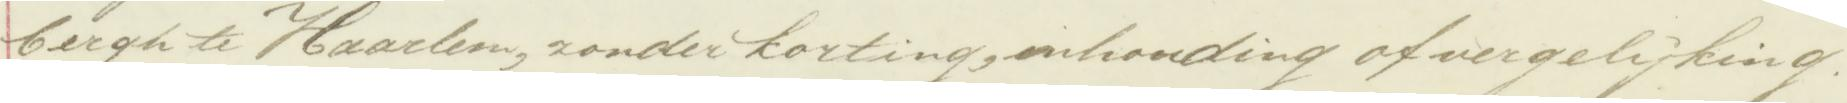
bergh te Haarlem, zonder korting, inhouding of vergelijking.
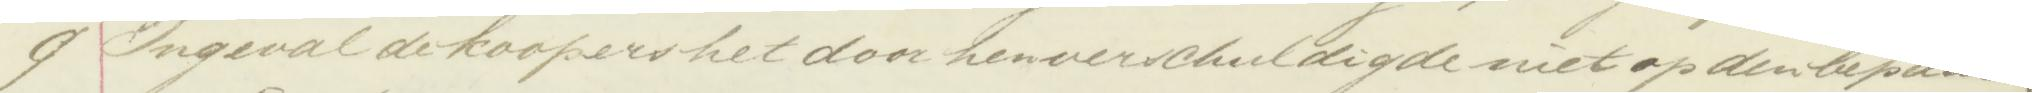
9 Ingeval de koopers het door hen verschuldigde niet op den bepaal
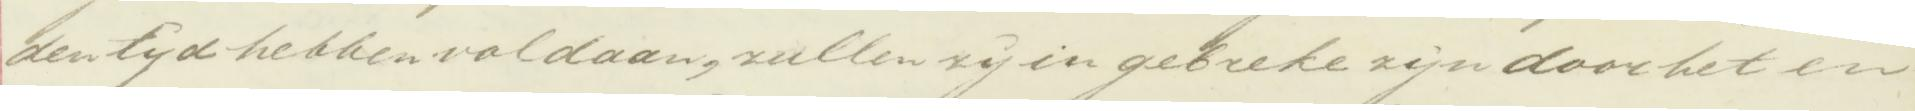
den tijd hebben voldaan, zullen zij in gebreke zijn door het en
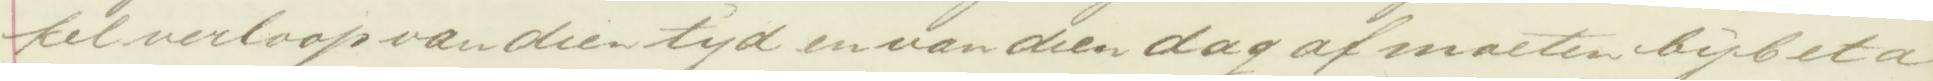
kel verloop van dien tijd en van dien dag af moeten bijbeta
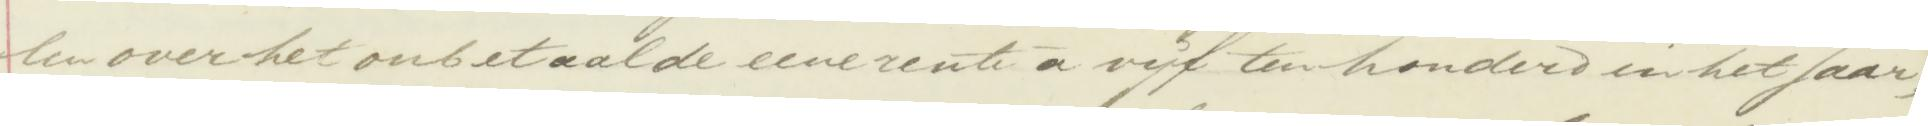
len over het onbetaalde eene rente a vijf ten honderd in het jaar
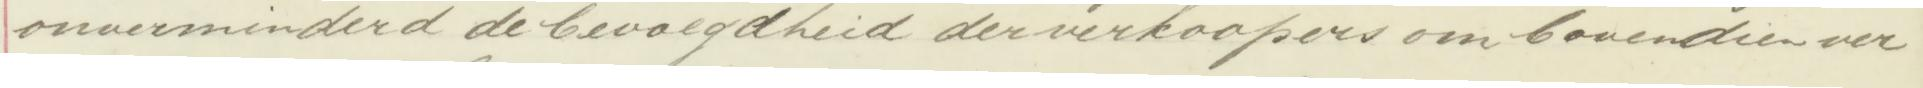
onverminderd de bevoegdheid der verkoopers om bovendien ver
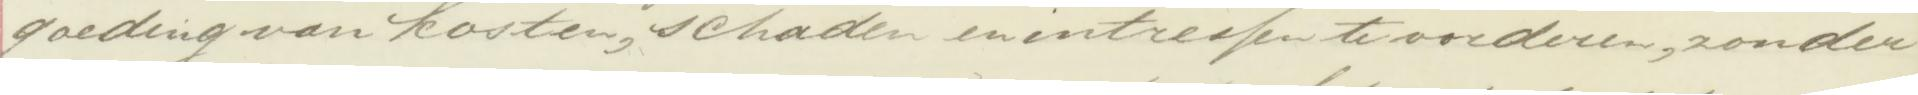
goeding van kosten, schaden en intressen te vorderen, zonder
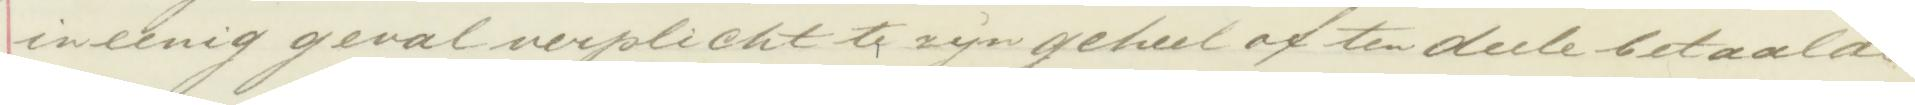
in eenig geval verplicht te zijn geheel of ten deele betaalde
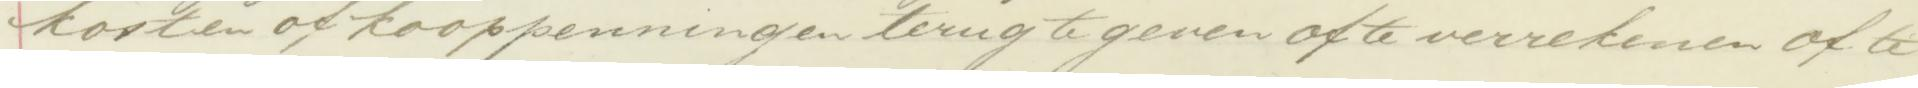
kosten of kooppenningen terug te geven of te verrekenen of te
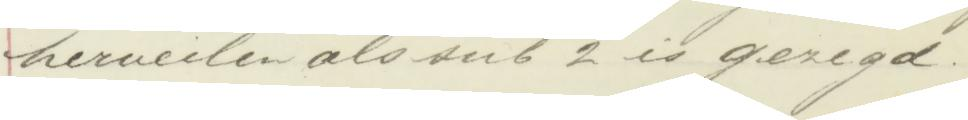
herveilen als sub 2 is gezegd
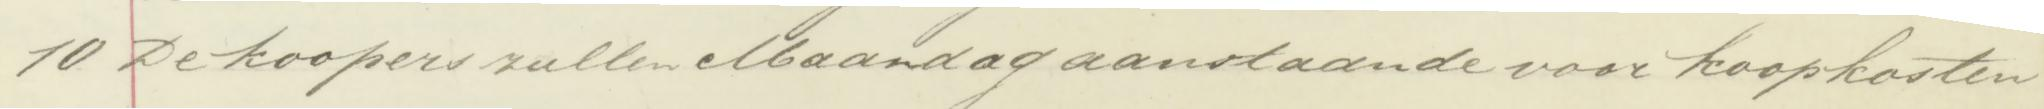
10 De koopers zullen Maandag aanstaande voor koopkosten
